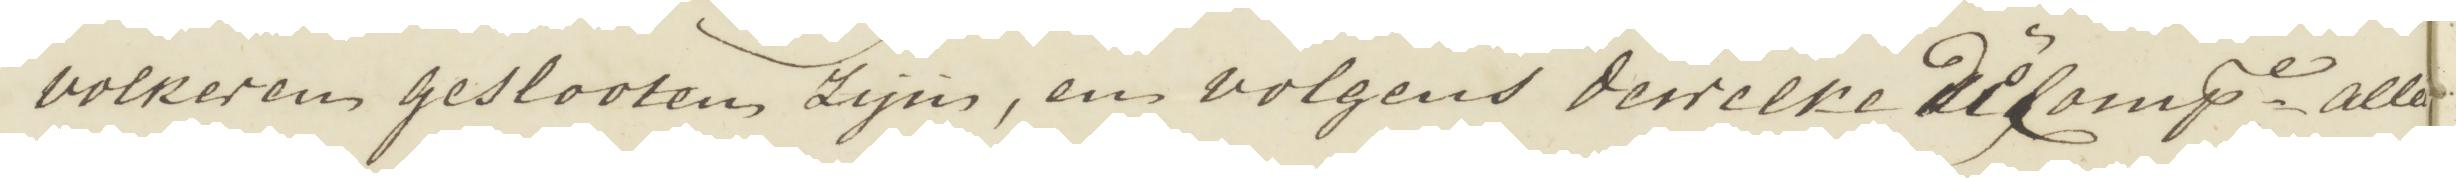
volkeren geslooten zijn, en volgens dewelke dE Comp=e alle
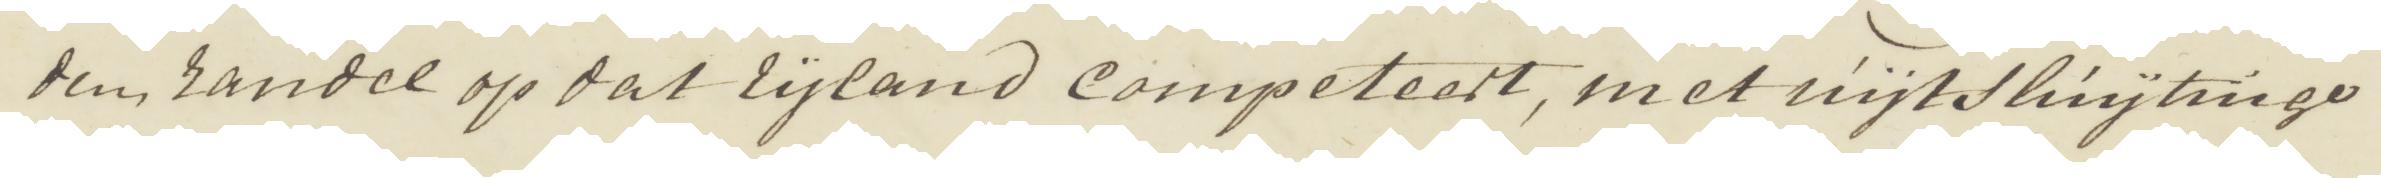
den handel op dat Eijland competeert, met uijtsluijtinge
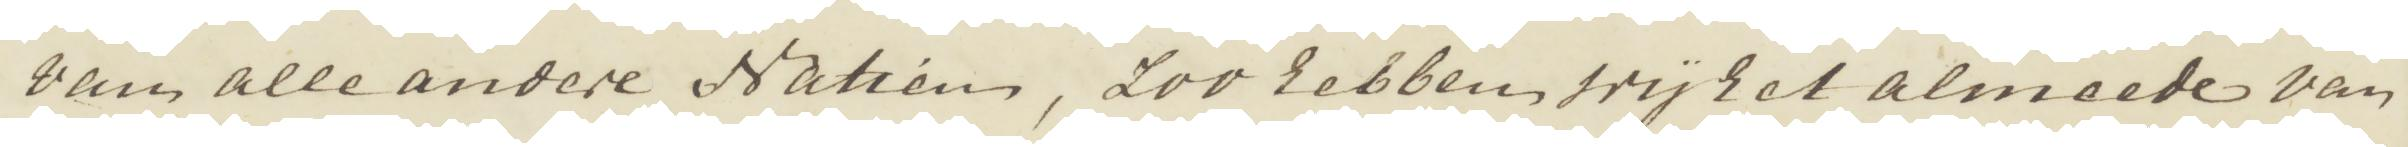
van alle andere Natien, zoo hebben wij het almeede van
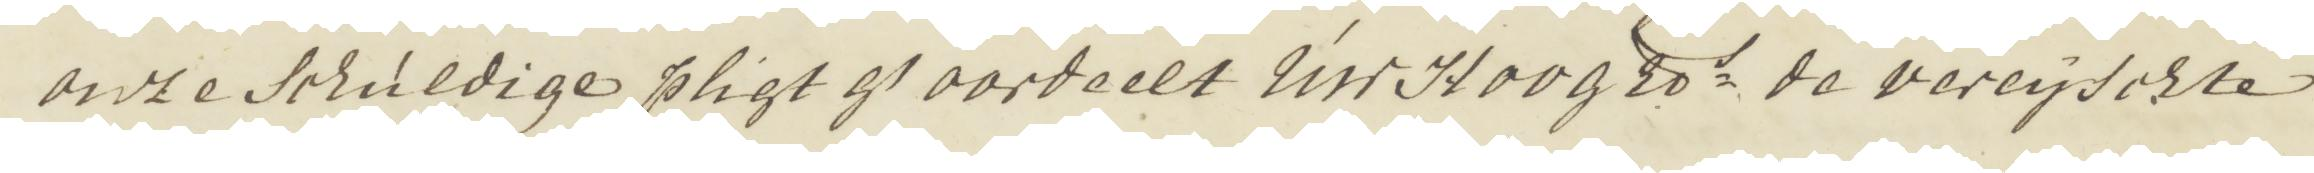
onze schuldige pligt g’oordeelt uw Hoog Ed=s de vereijschte
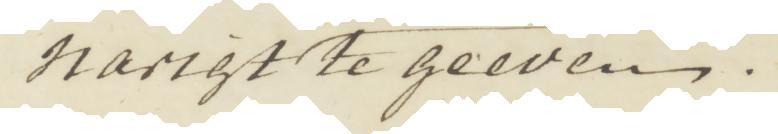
narigt te geeven.
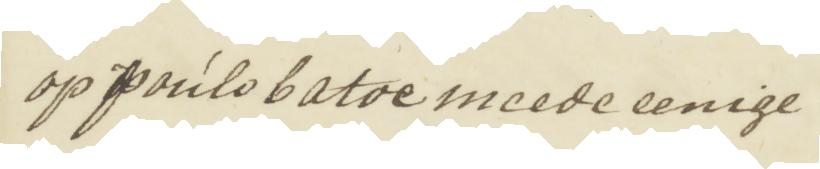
op poulo batoe meede eenige
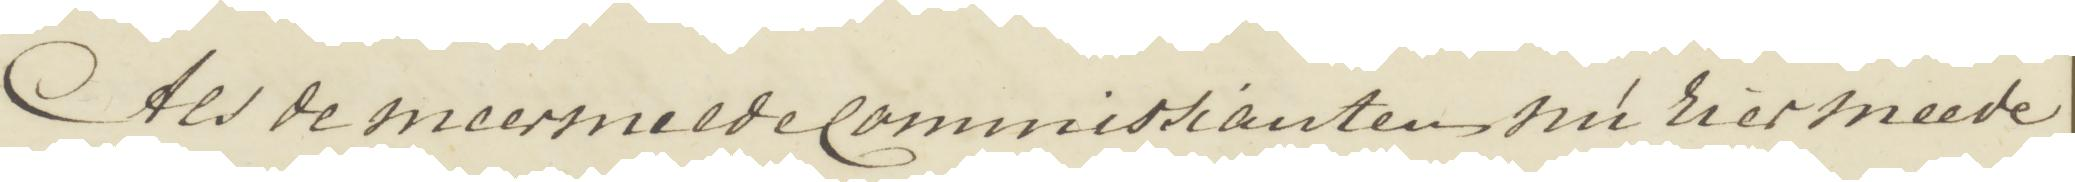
Als de meermeede commissianten nu hier meede
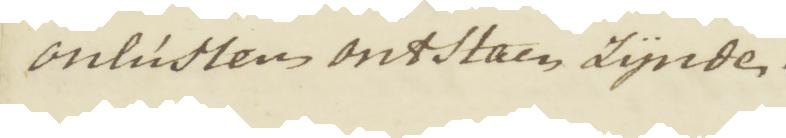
onlusten ontstaen zijnde.
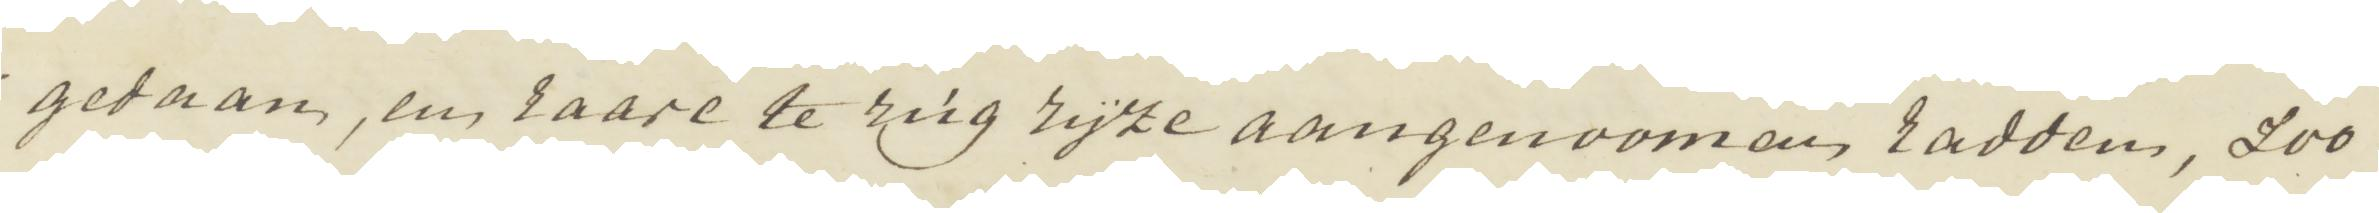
gedaan, en haare te rug rijze aangenoomen hadden, zoo
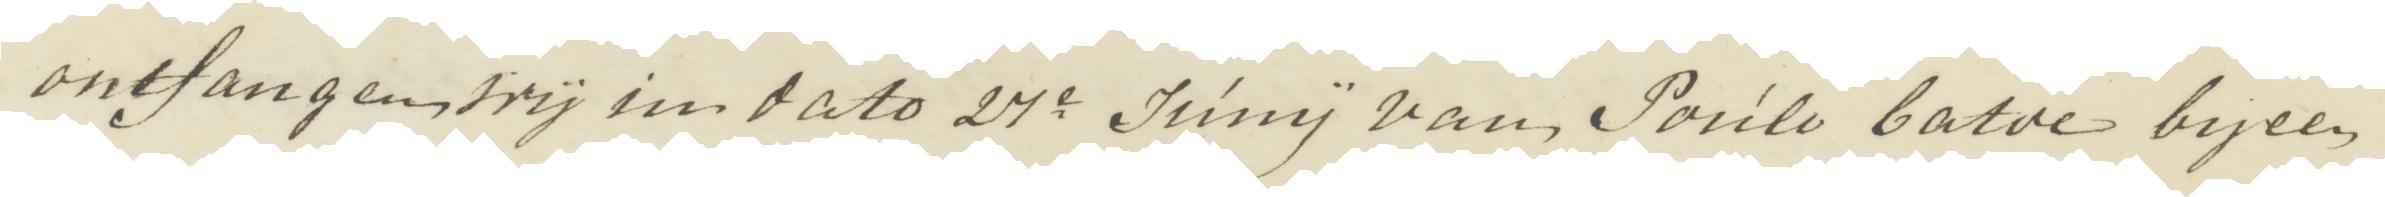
ontfangen rij in dato 27=e Junij van Poulo batoe bij een
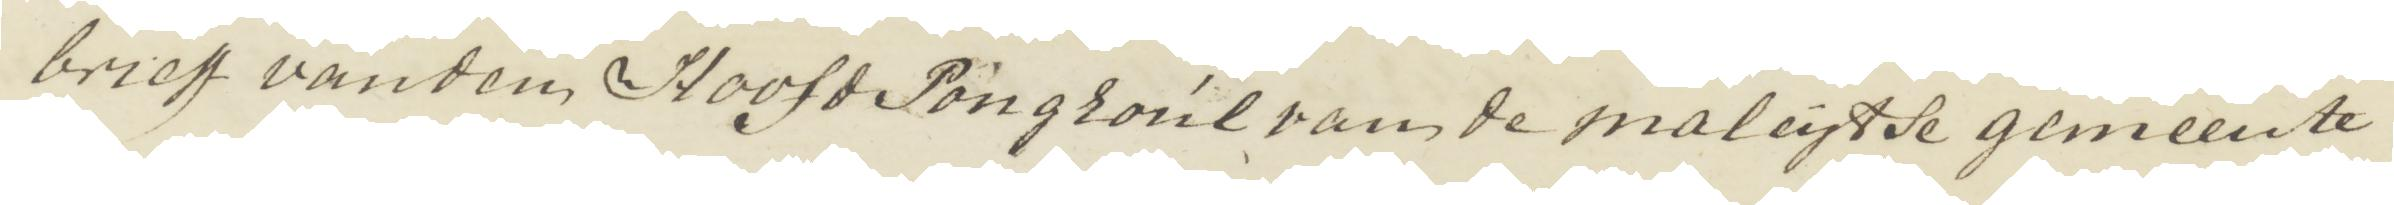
brieff van den Hoofd Ponghoul van de maleijtse gemeente
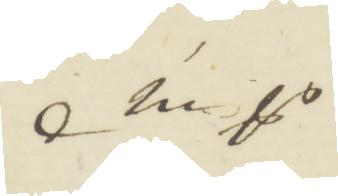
In so
